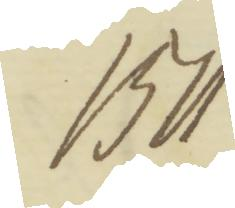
1511
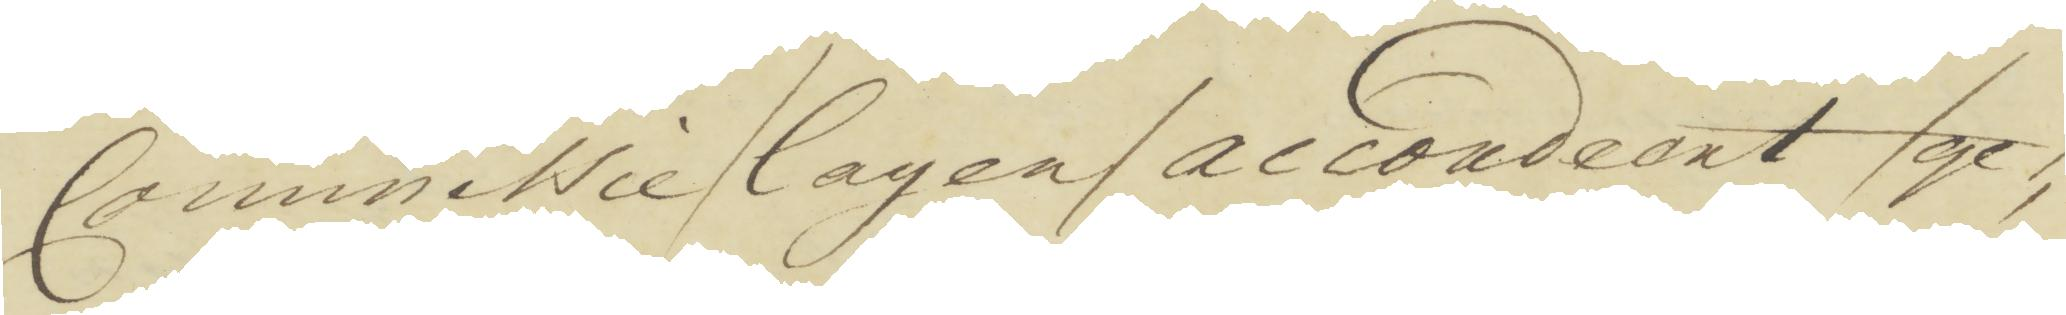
Commissie /lager/ accordeert /ge„
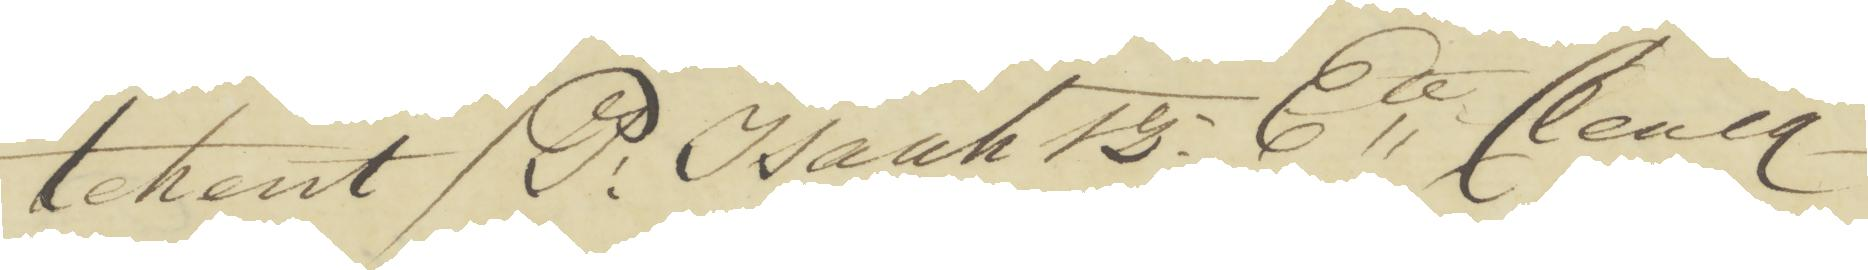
tekent / P: Isaaksz: E„te Clercq
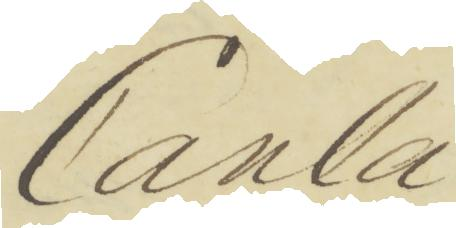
Carla
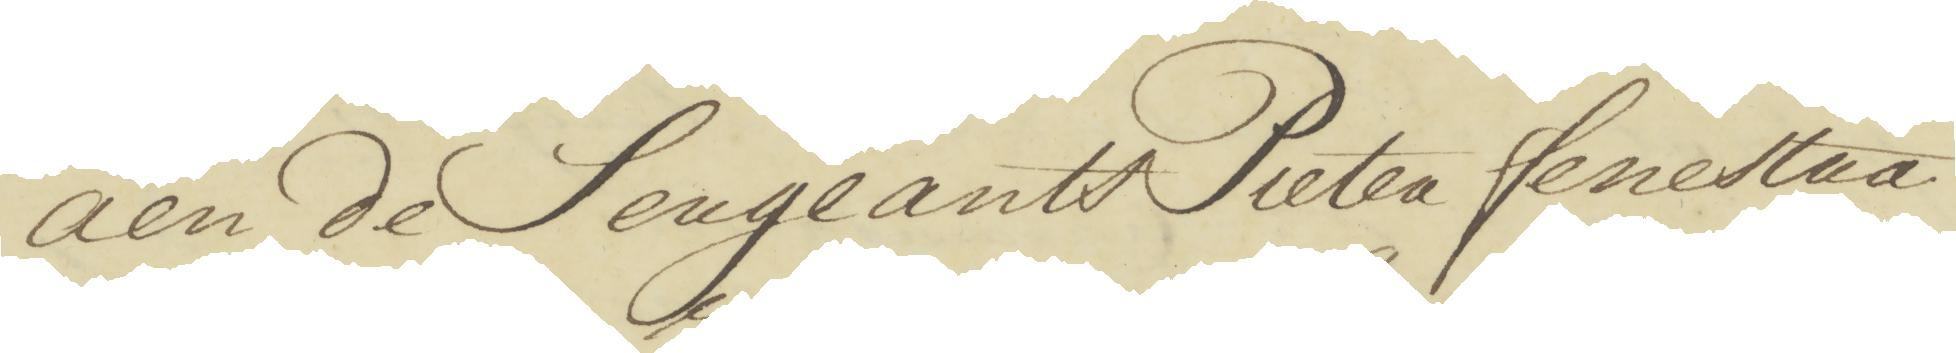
aen de Sergeants Pieter fenestra
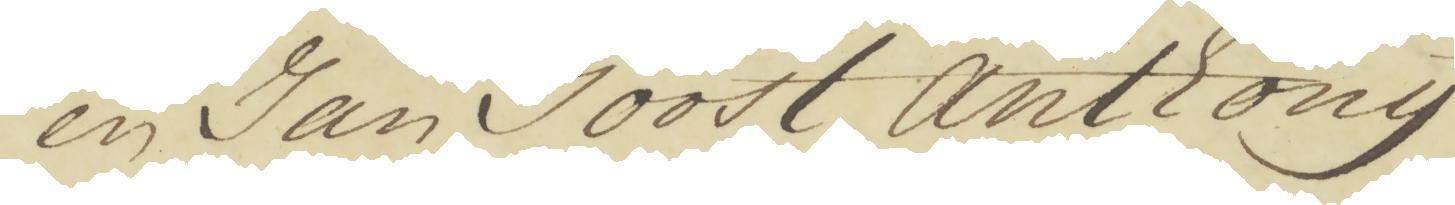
en Ian Ioost Anthonij
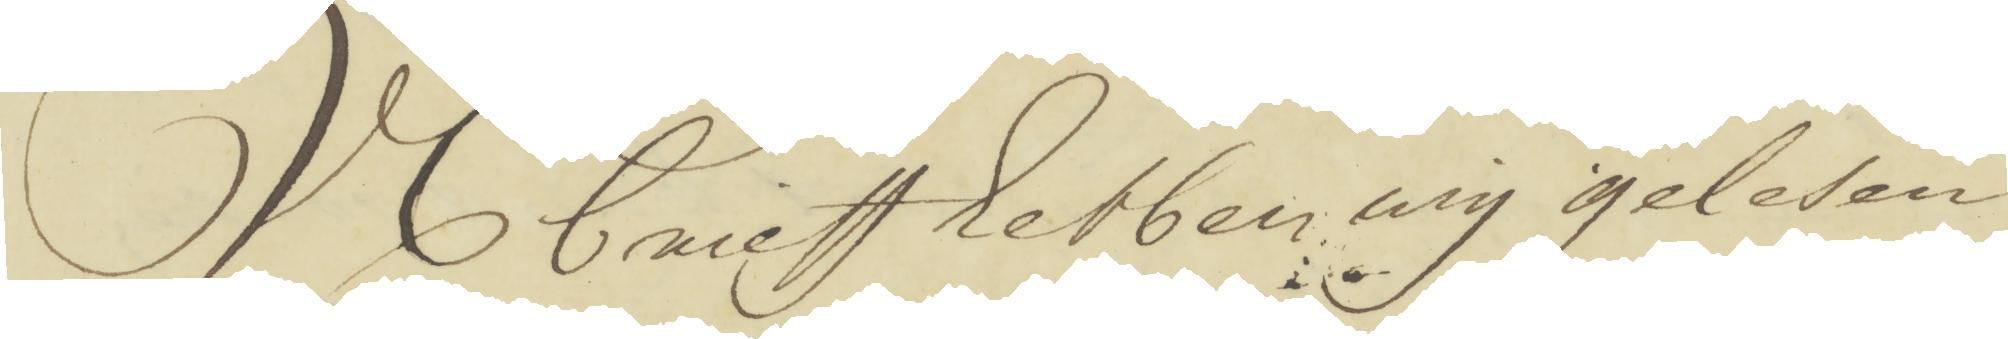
VE brieff hebben wij gelesen
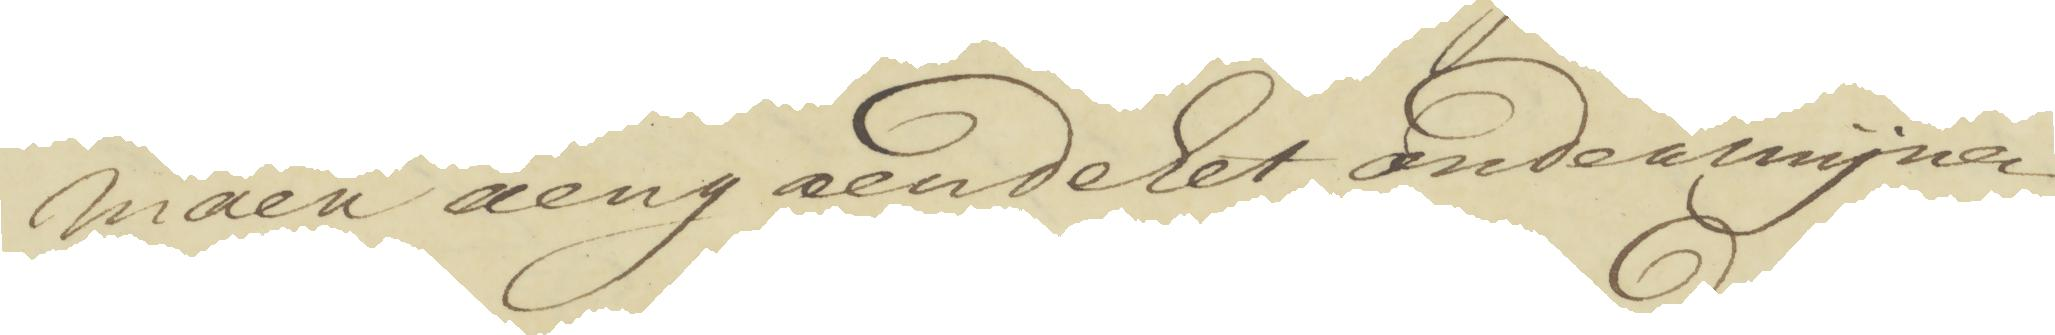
maer aengaende het ondermijnen
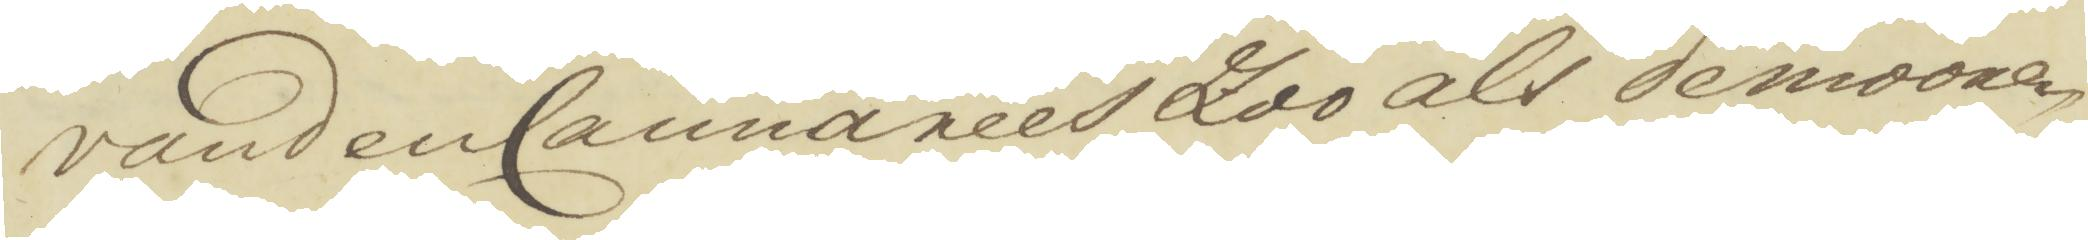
van den Cannarees zoo als demooren
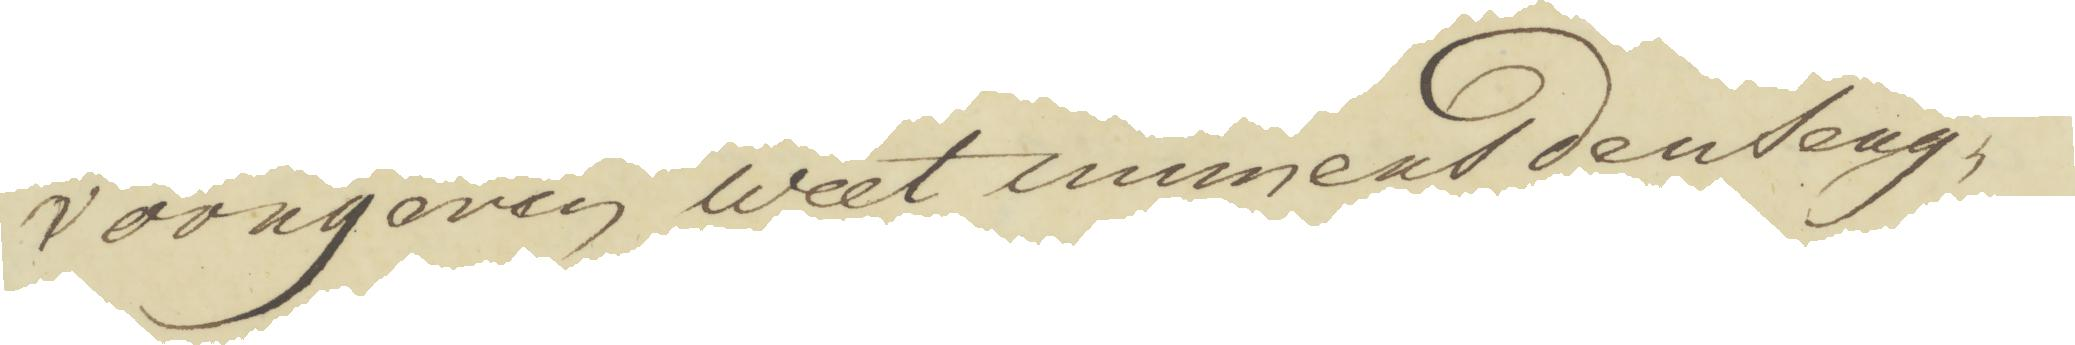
voorgeven weet immers den serg„ts
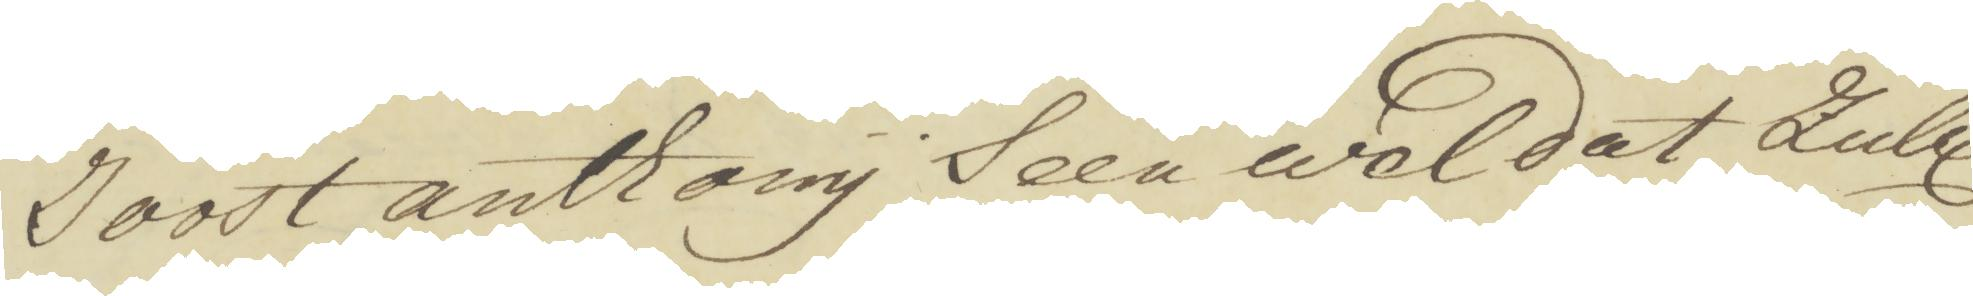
Ioost anthonij seer wel dat zulx
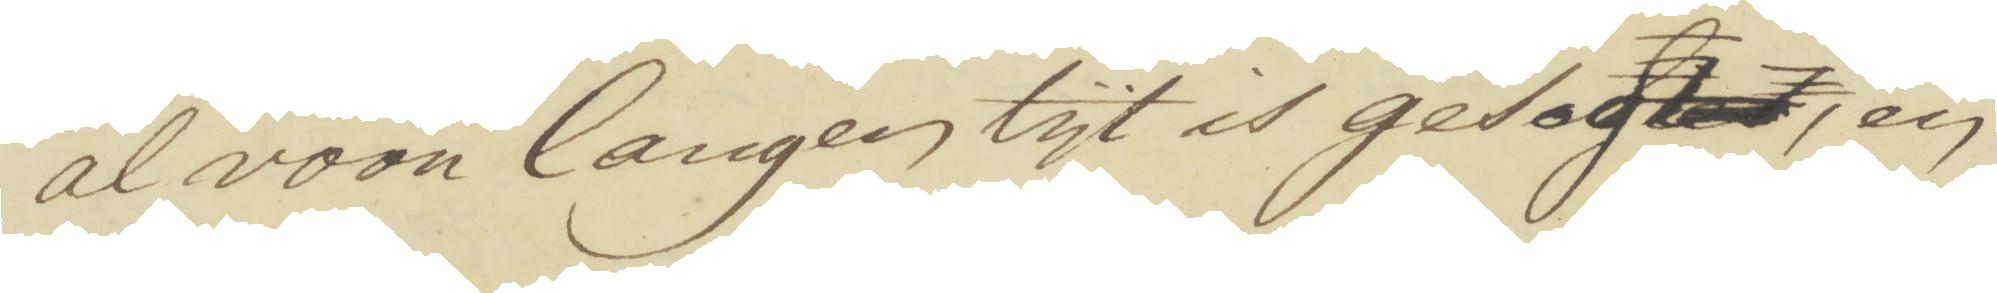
al voor langen tijt is gesogte, en
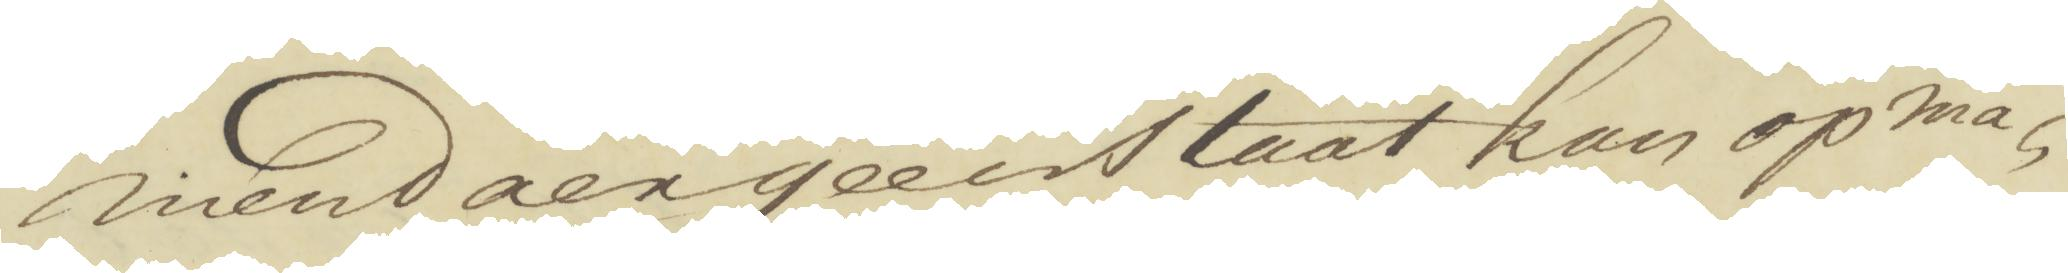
men daer geenstaat kan op ma„
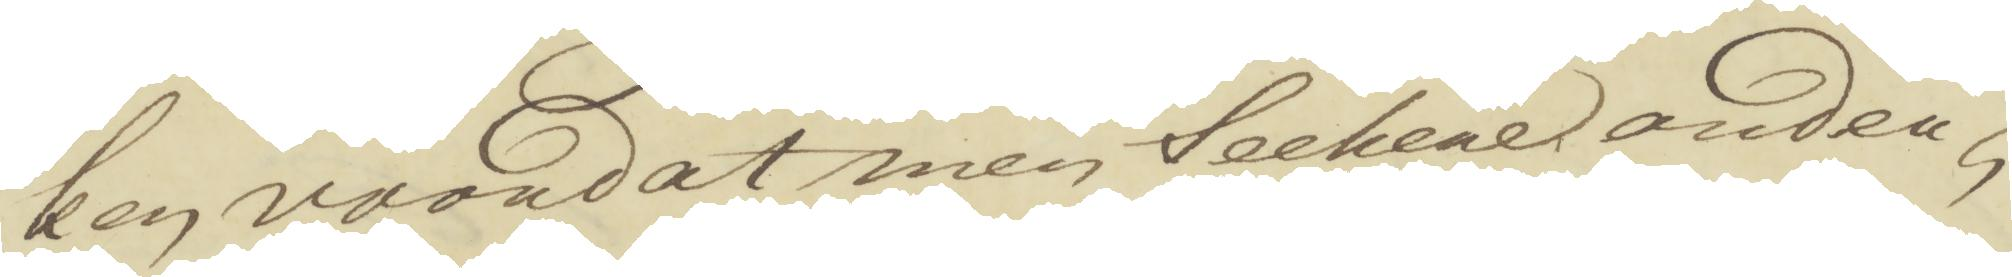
ken voor dat men seekere onder„
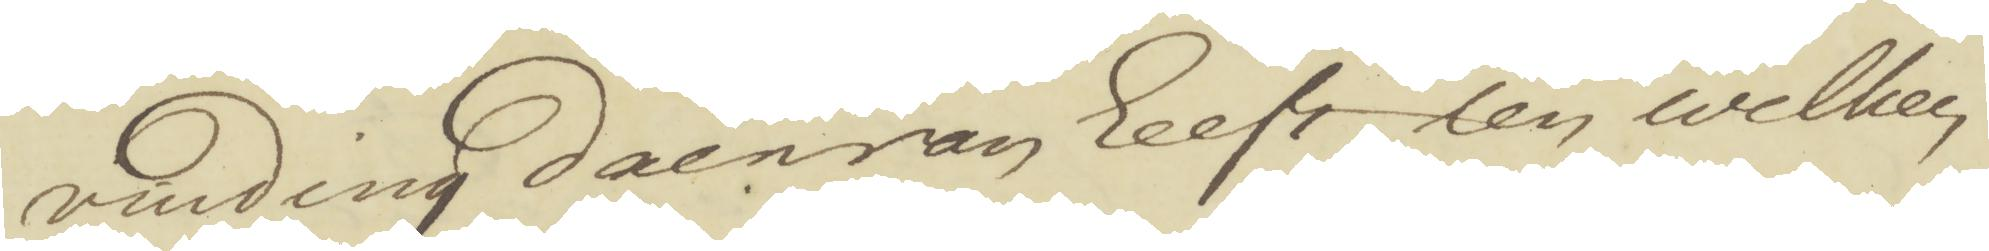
vinding daer van heeft, ten welken
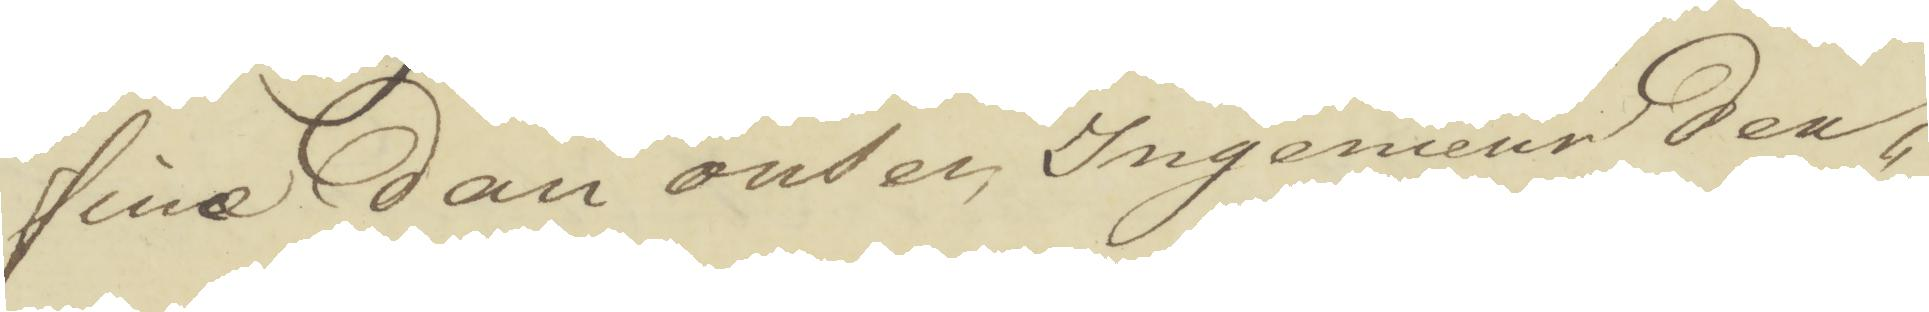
fine dan onsen Ingenieur der„
